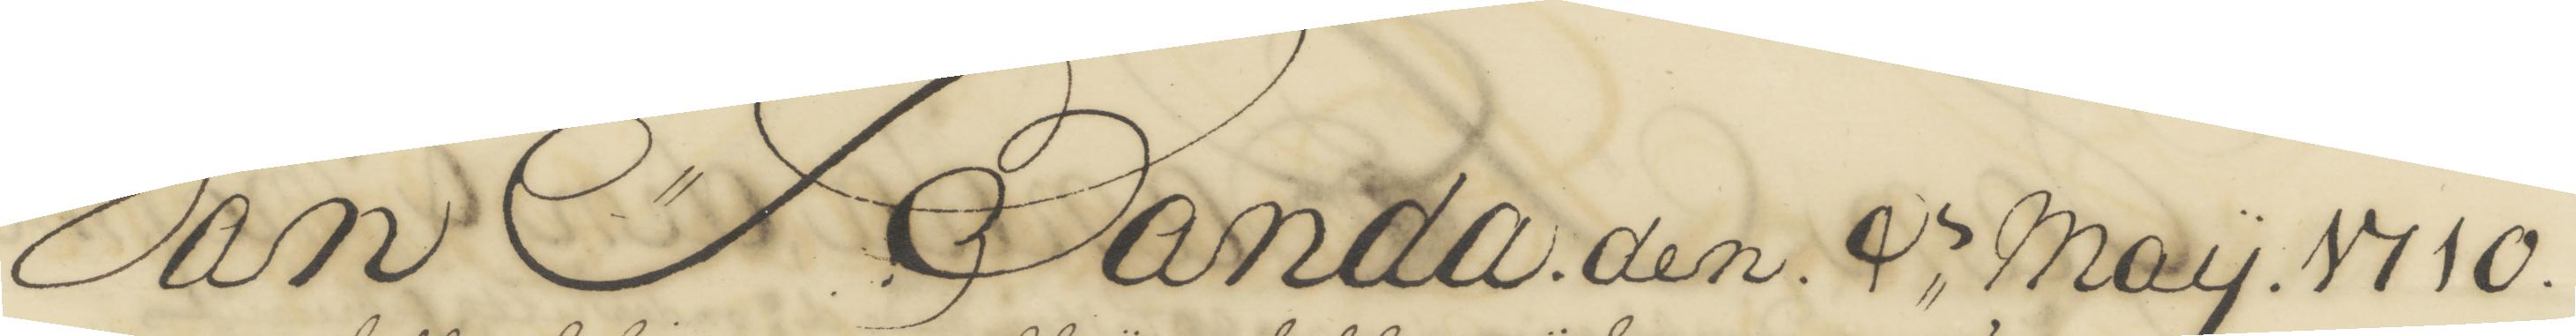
Van Banda. den. 4„' Maij. 1710.
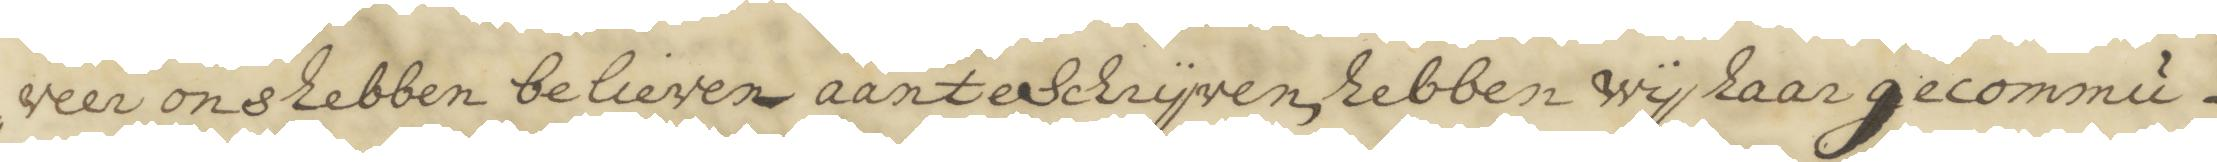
veer ons hebben believen aan te schrijven, hebben wij haar gecommu
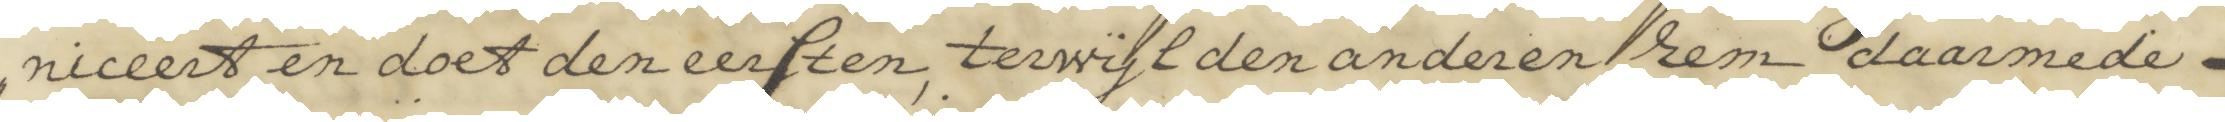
niceert en doet den eersten, terwijl den anderen hem daarmede
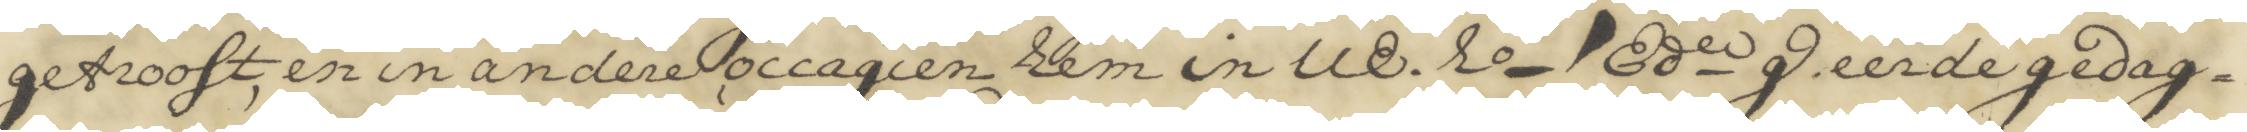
getroost, en in andere occagien hem in UE. h-o Ed-le g.eerde gedag=
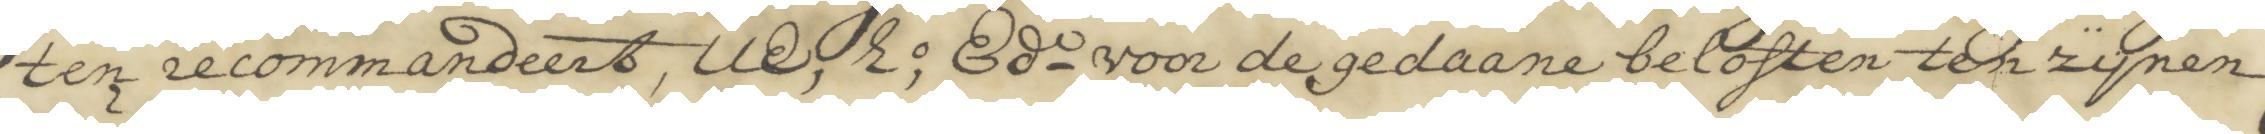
ten recommandeert, UE, h,o Ed-e voor de gedaane beloften ten zijnen
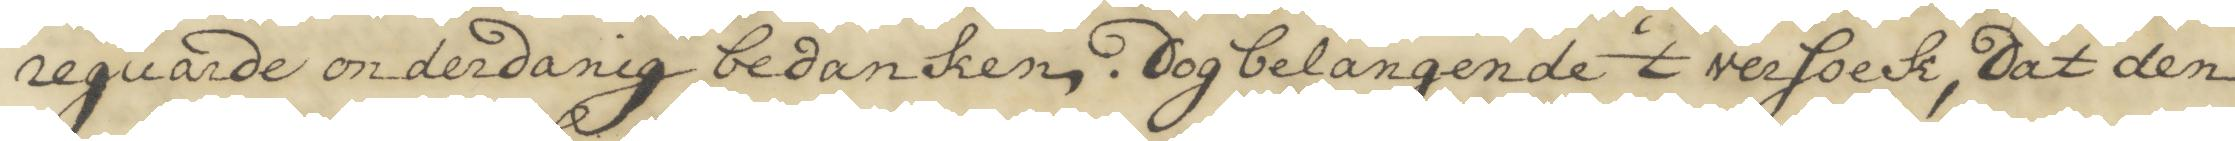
reguarde onderdanig bedanken. dog belangende ’t versoek, dat den
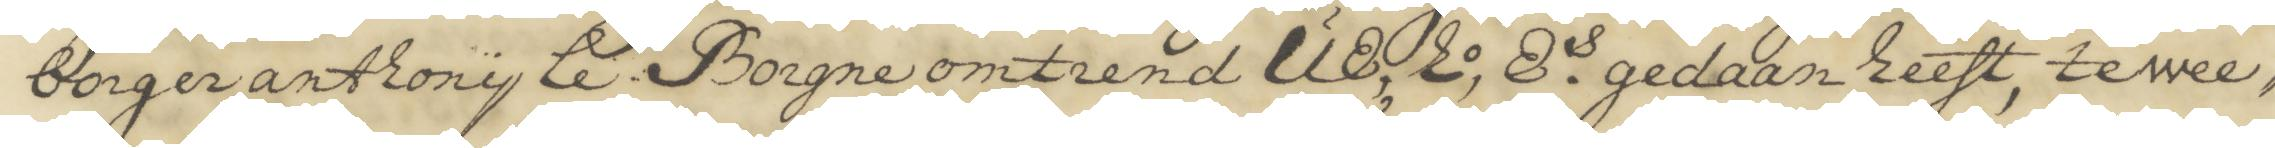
borger anthonij le Borgne omtrend UE, h,o E.s gedaan heeft, te wee
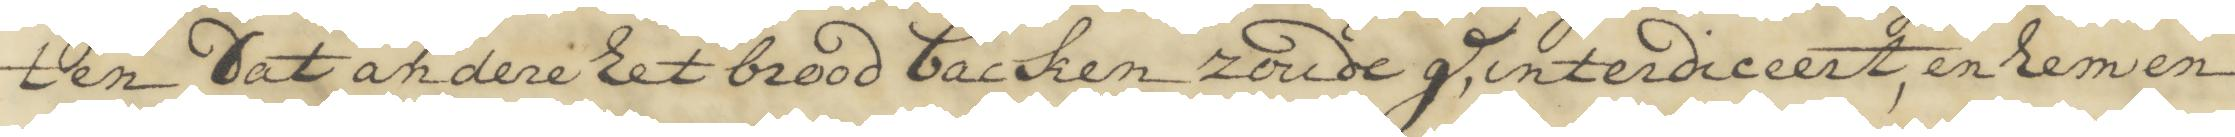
ten dat andere het brood backen zoude g’interdiceert, en hem en
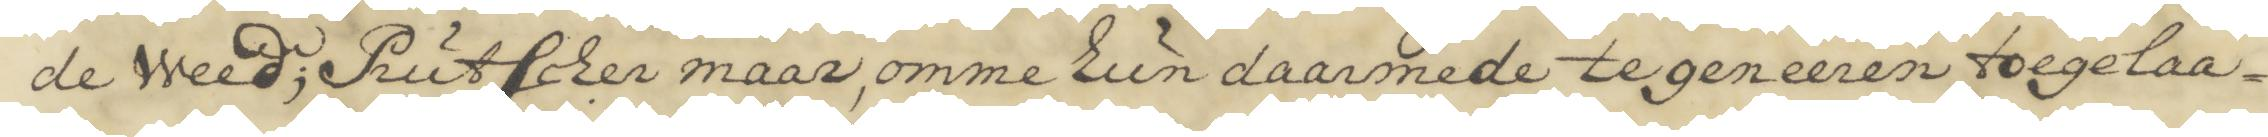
de WelE;e Prutscher maar, omme hun daarmede te geneeren toegelaa
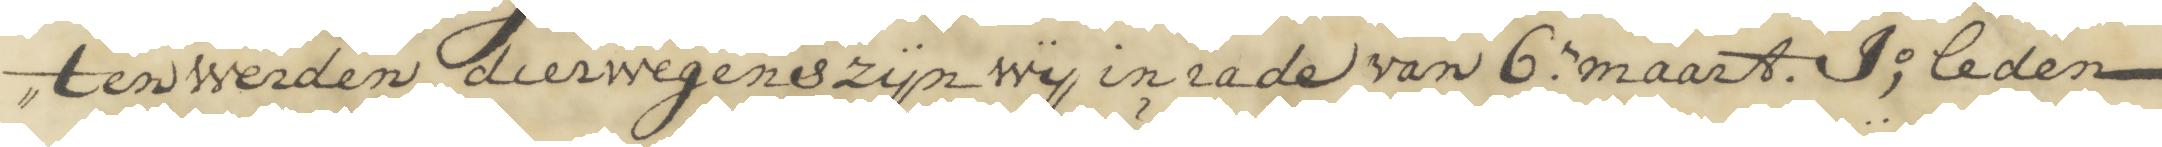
„ten werden, dierwegens zijn wij in rade van 6.en maart. I,o leden
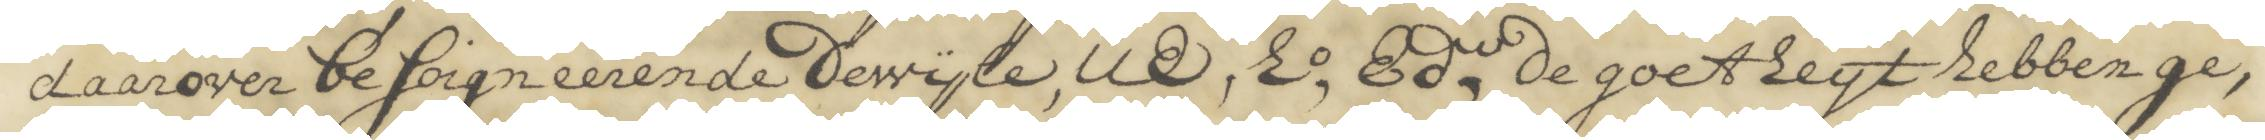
daarover besoigneerende dewijle, UE, h,o Ed,le de goetheijt hebben ge,
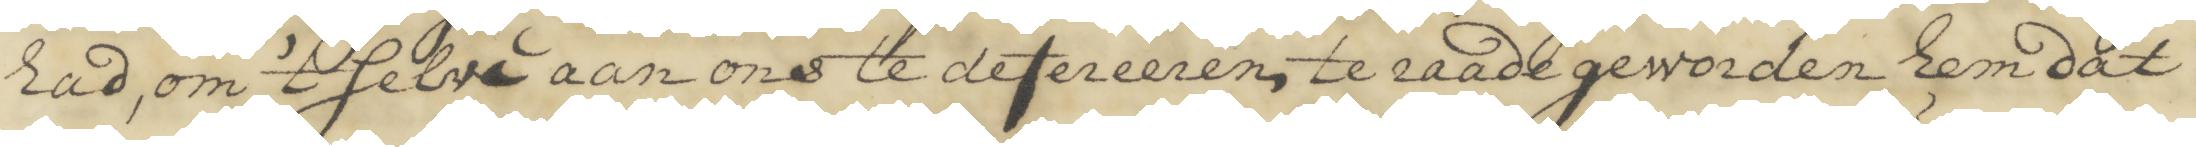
had, om ’t selve aan ons te defereeren te raade geworden hem dat
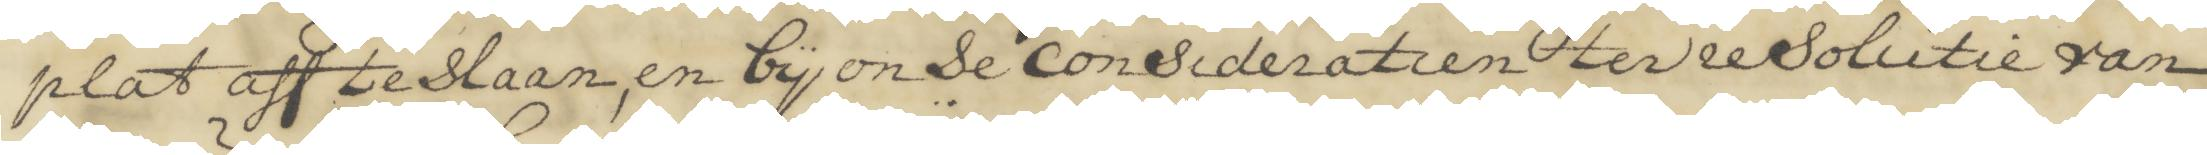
plat aff teslaan, en bij onse consideratien ter resolutie van
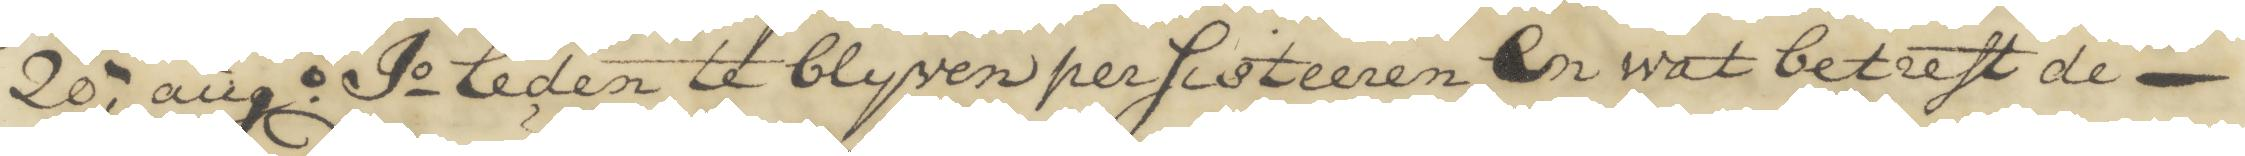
20,' aug.o I-o leden te blijven persisteeren, en wat betreft de —
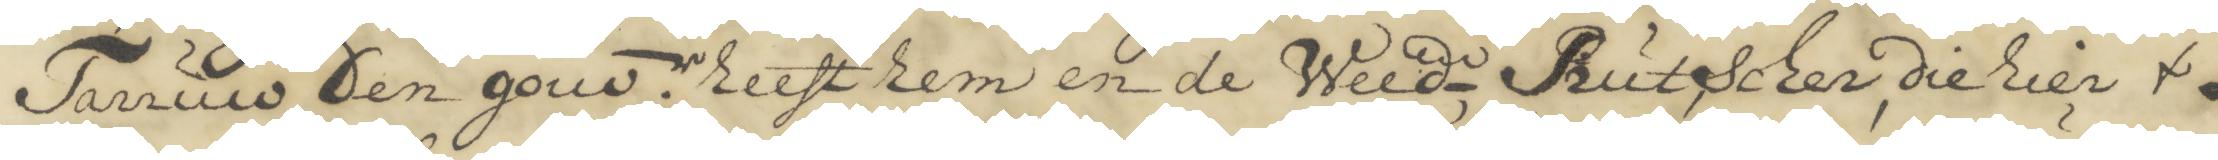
Tarruw, den gouv:r heeft hem en de WelE-e Prutscher, die hier t
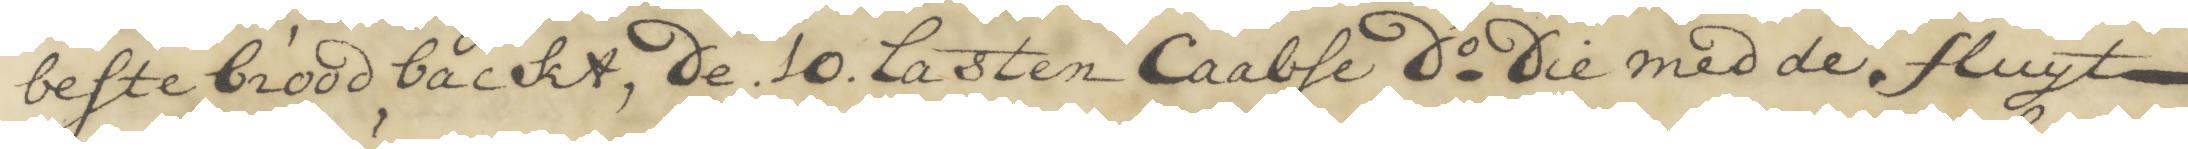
beste brood backt, de. 10. lasten Caabse d-o die med de fluijt
